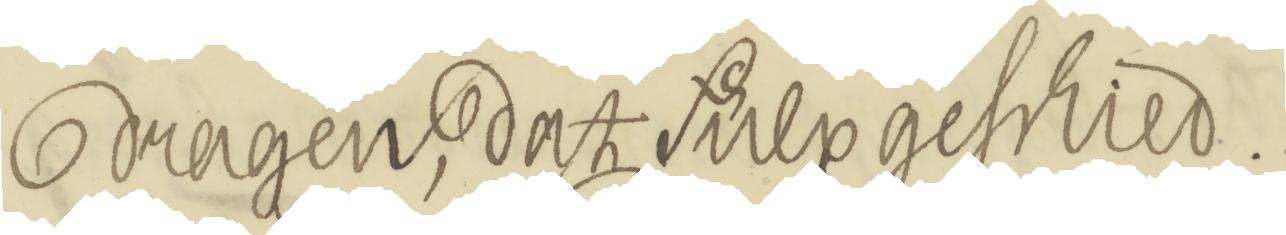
dragen, dat sulx geschied.
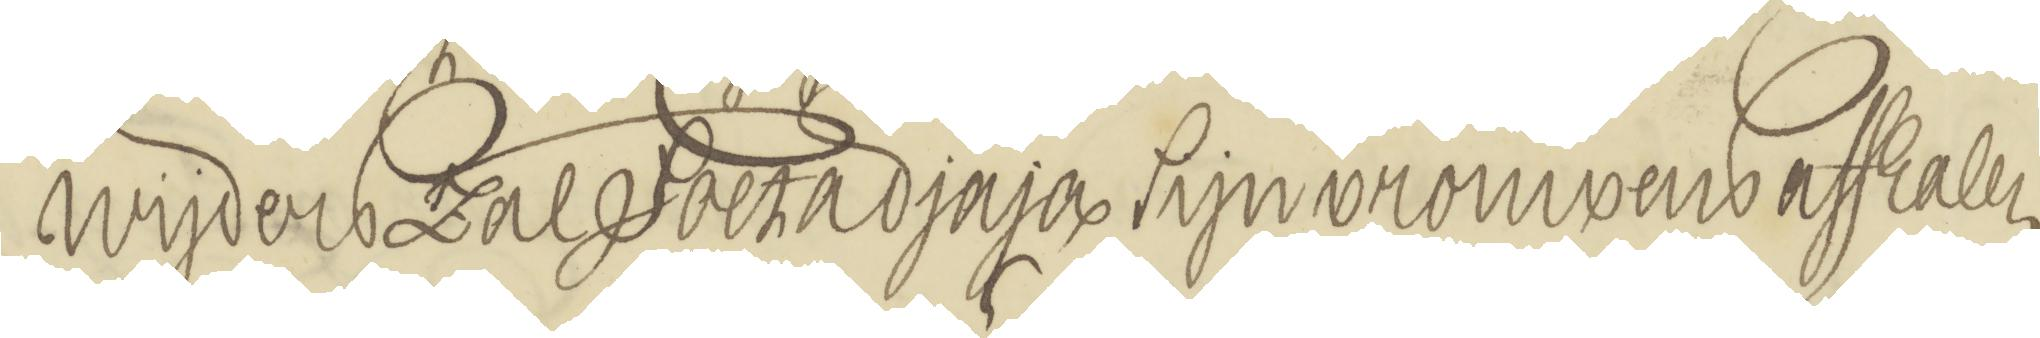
wijders zal Soetadjaja sijn vrouwens affhalen
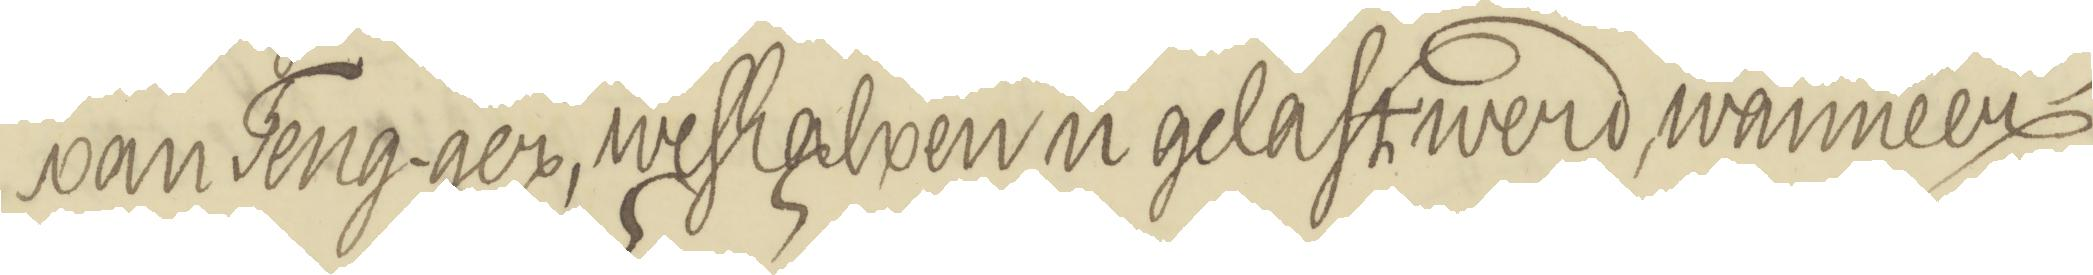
van Teng-ger, weshalven u gelast werd, wanneer
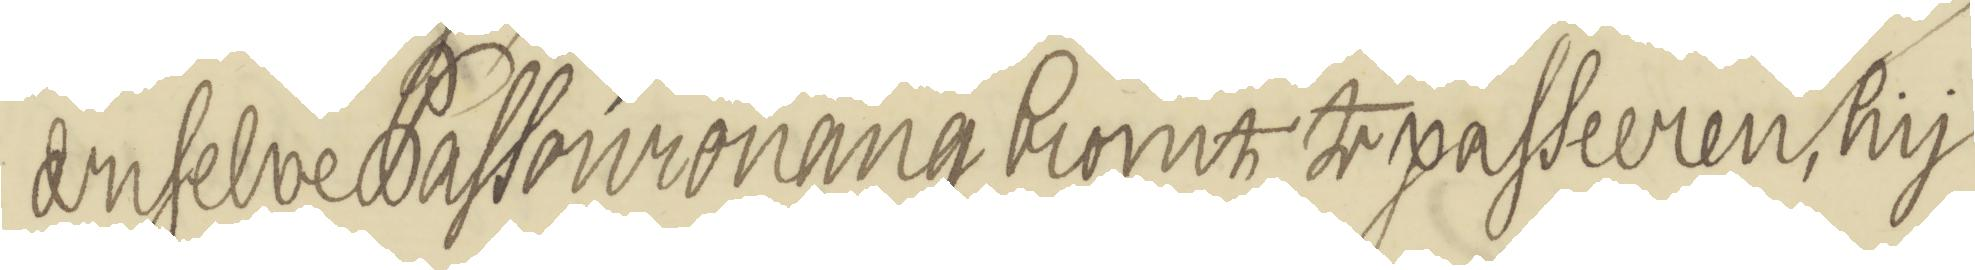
denselve Passourouang komt te passeeren, hij
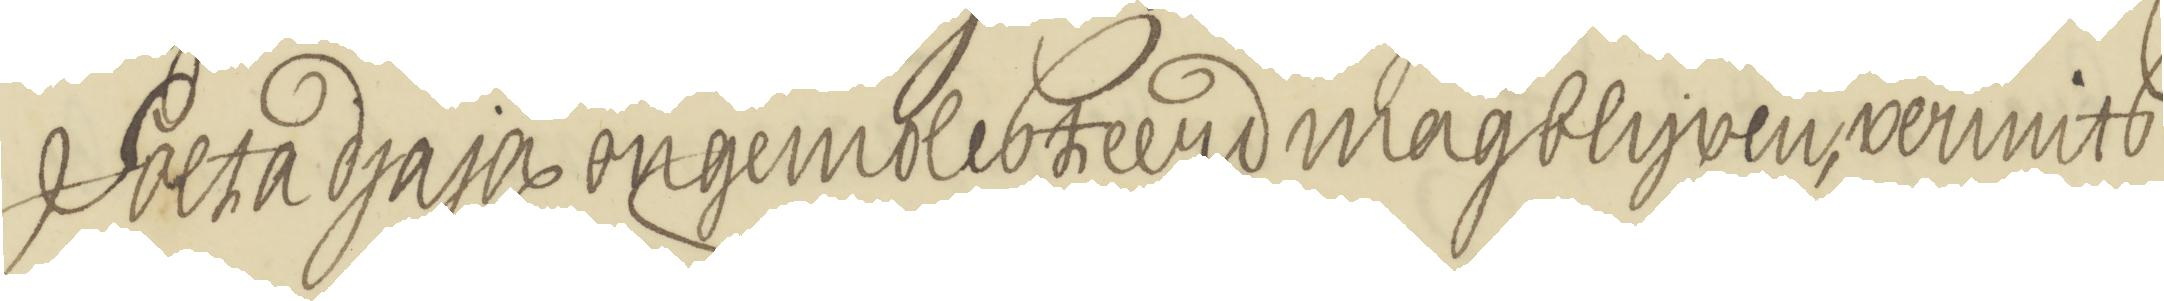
Soetadjaja ongemolesteerd mag blijven, vermits
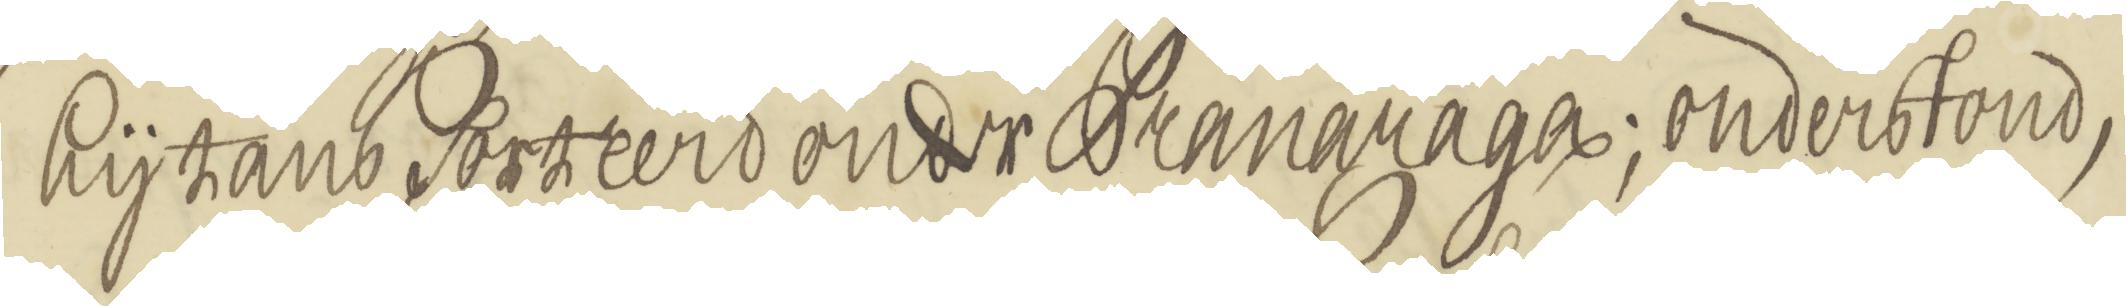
hij tans sorteerd onder Pranaraga; onderstond,
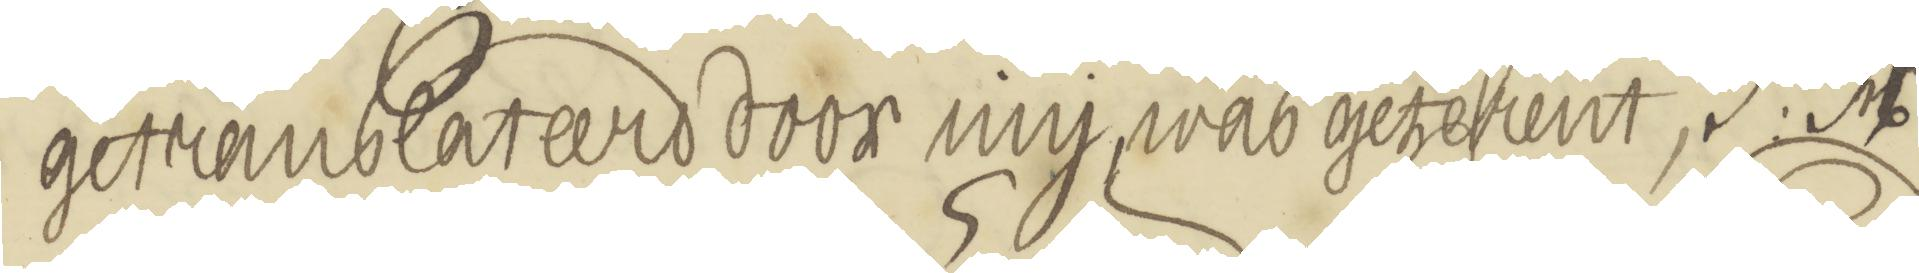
getranslateerd door mij, was getekent, J:n A
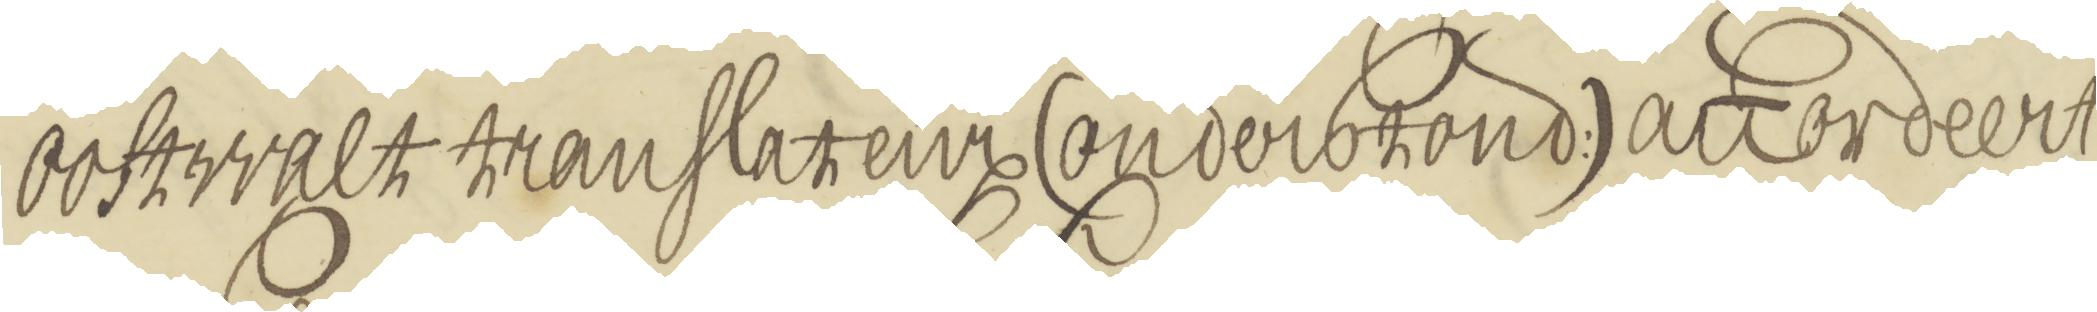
oostwalt translateur (onderstond:) accordeert
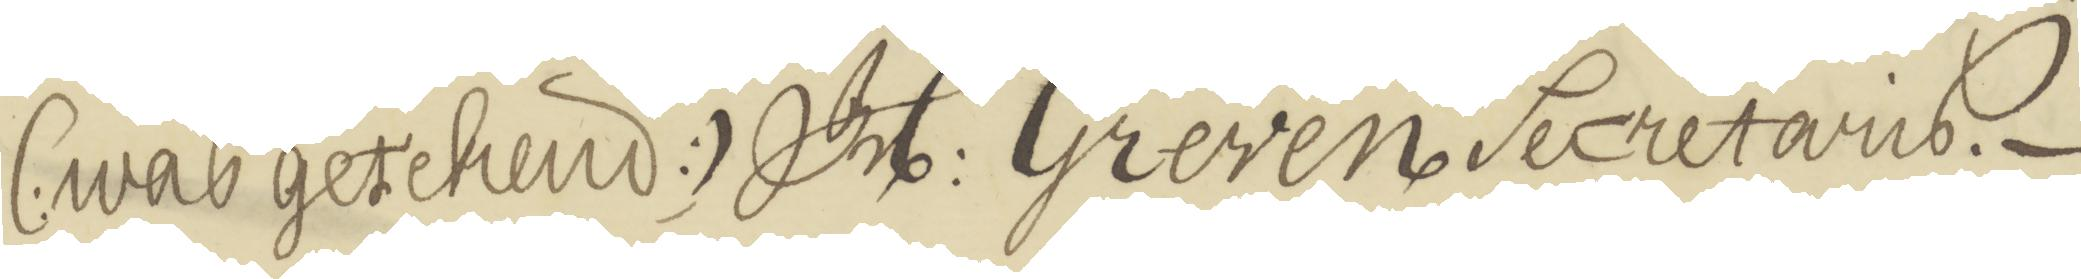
(:was getekend:) H: Greven secretaris._
